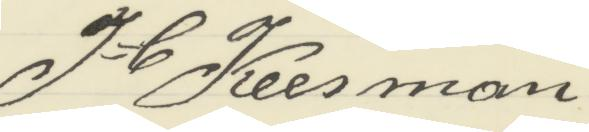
J-b Keesman
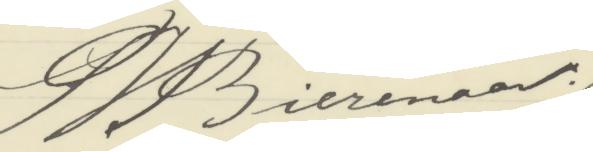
PJ Biezenaar
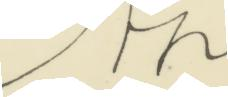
AD
